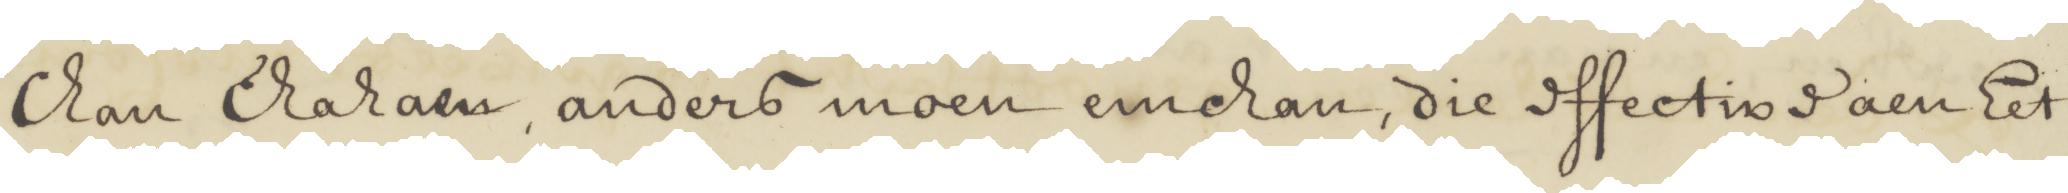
Chan Chahaen, anders moen emchan, die effective aen het
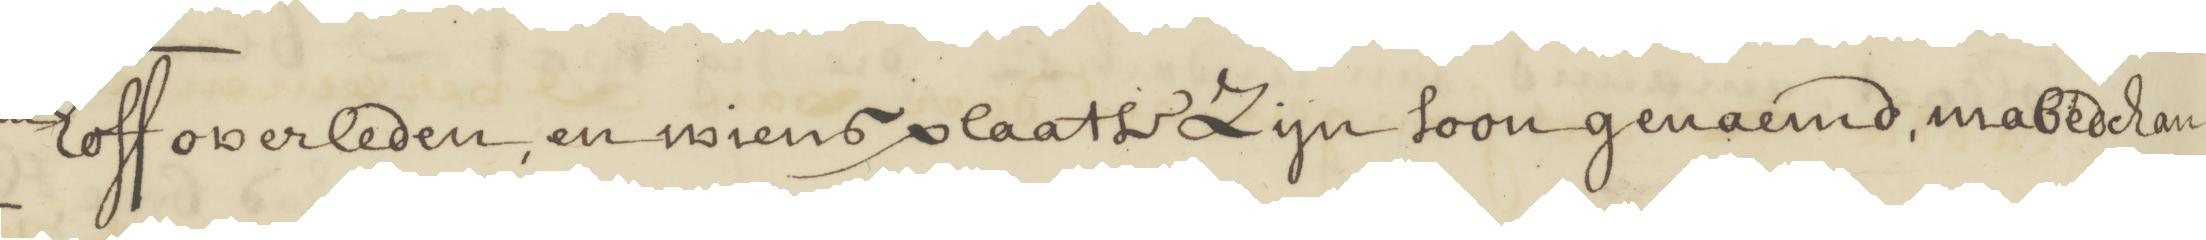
hoff overleden, en wiens plaatse zijn soon genaemd, mabedchan
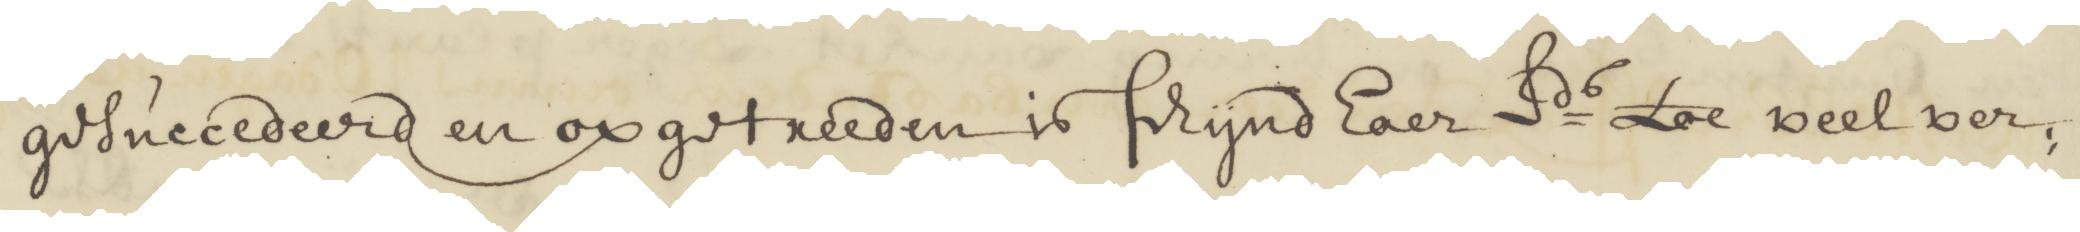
gesuccedeerd en op getreeden is schijnd haer E=ds toe veel ver„
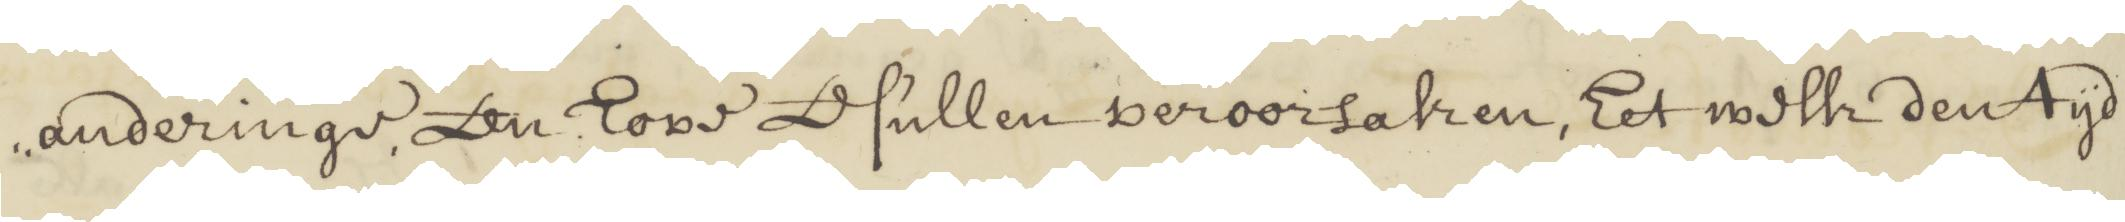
„anderinge, ten hove tesullen veroorsaken, het welk dentijd
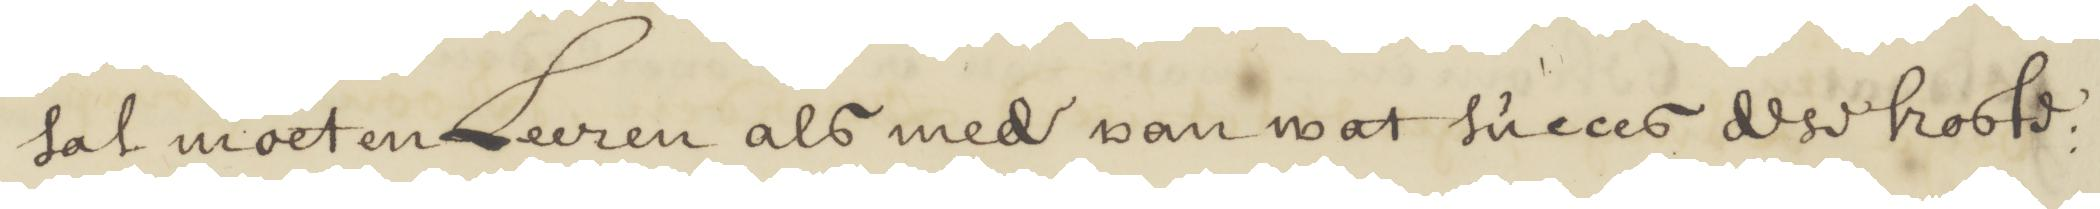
sal moeten Leeren als mede van wat succes dese koste:
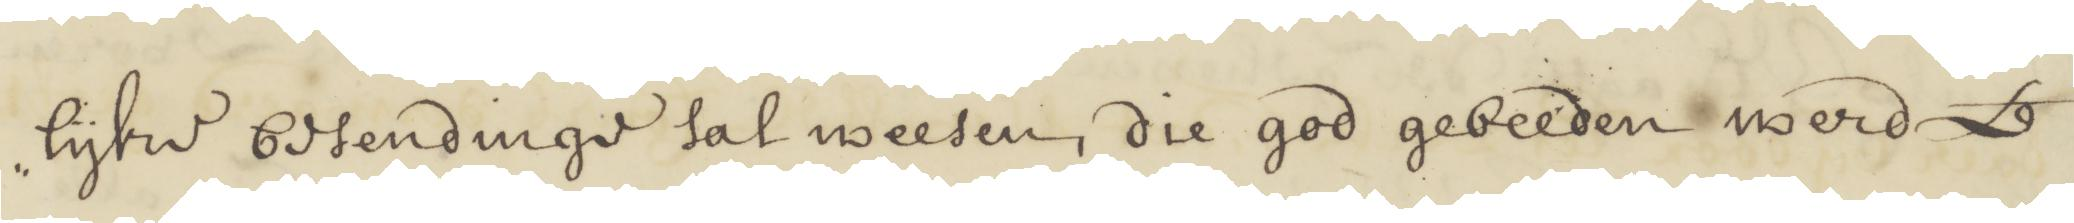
„lijke besendinge sal weesen, die god gebeeden werd te
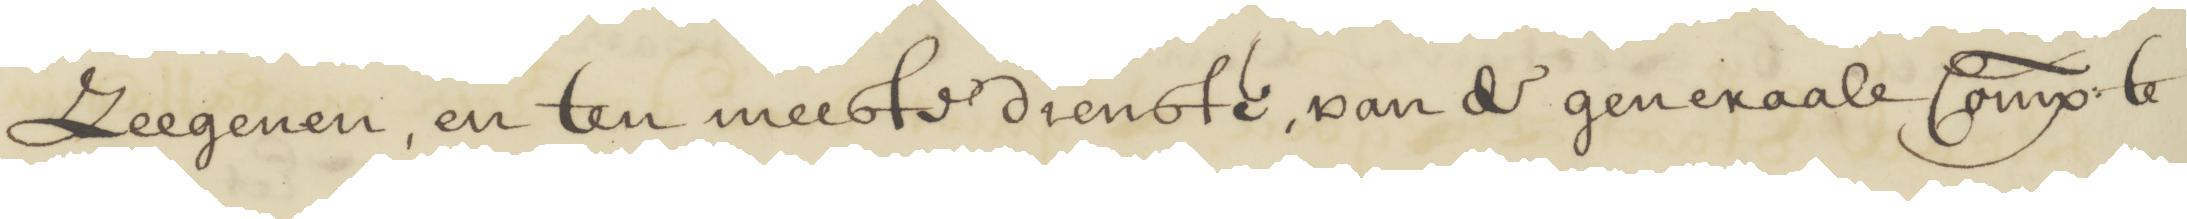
Zeegenen, en ten meeste dienste, van de generaale Comp: te
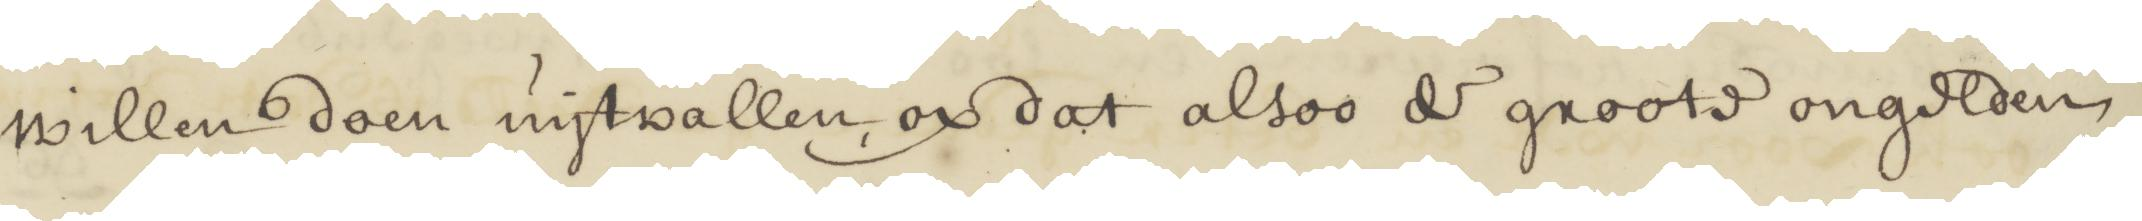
willen doen uijtvallen, op dat alsoo de groote ongelden
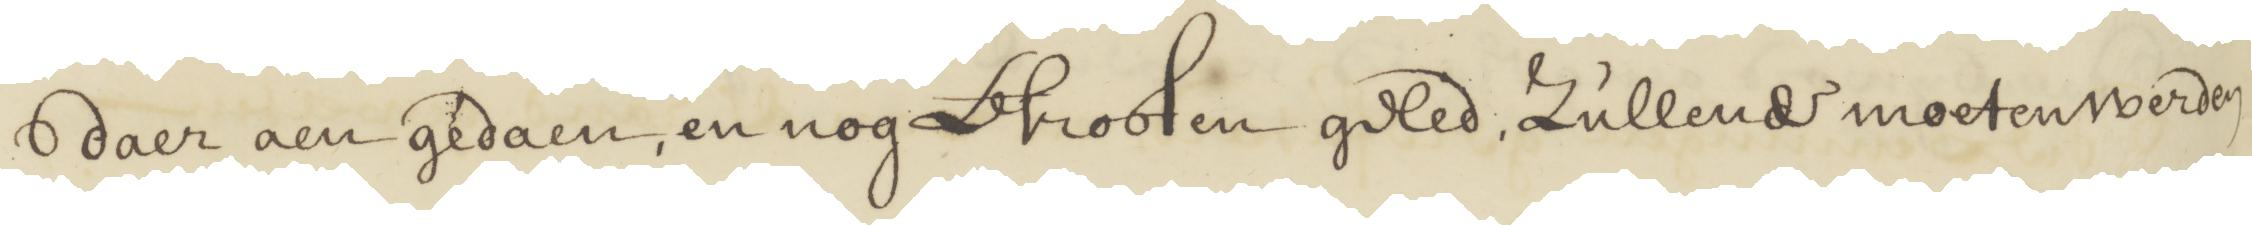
daer aen gedaen, en nog tekosten geled, zullende moeten werden
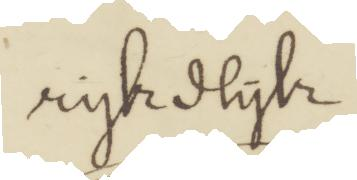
rijkelijk
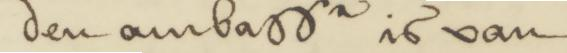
den ambassr is van
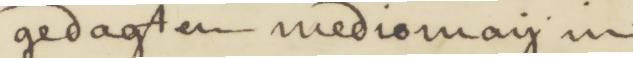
gedagten medio maij in
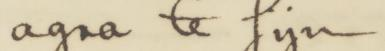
agra te sijn
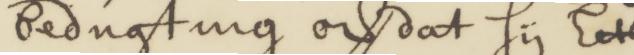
bedugting over dat sij het
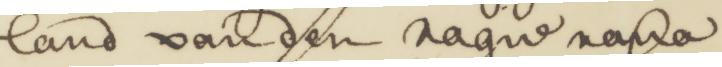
land van den ragie rana
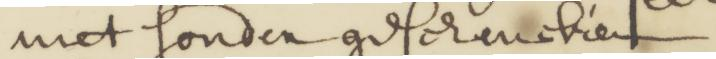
niet sonder geschencken
